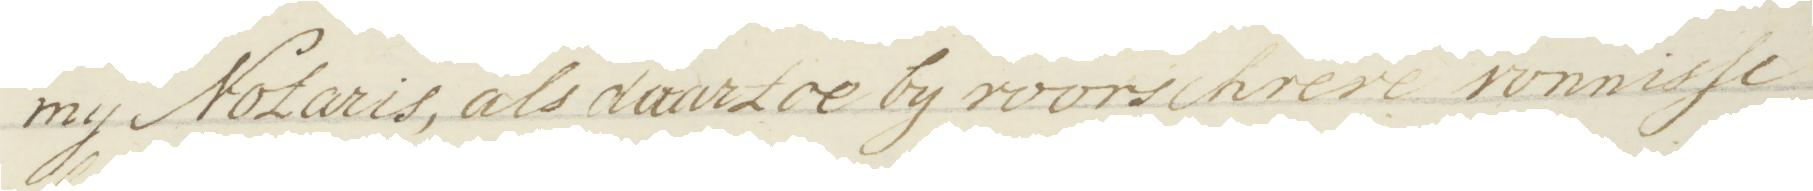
my Notaris, als daartoe by voorschreve vonnisse
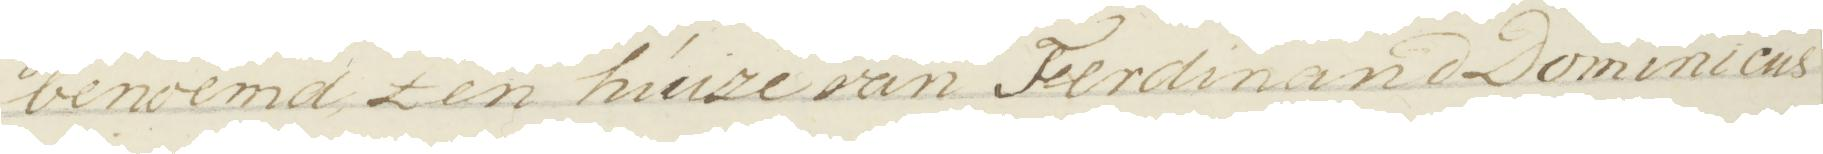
benoema ten huize van Ferdinand Dominicus
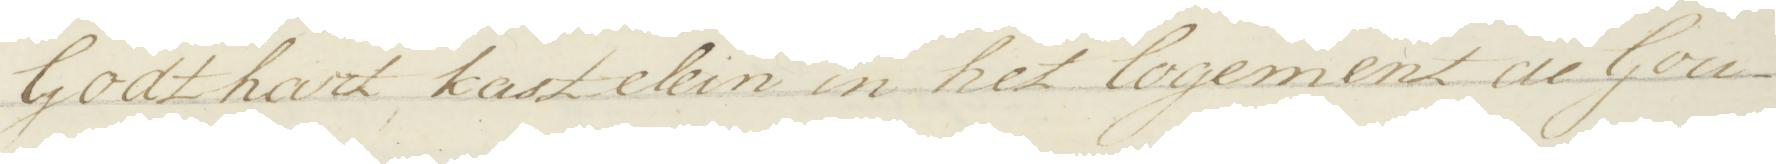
Godthart kastelein in het logement de Gou-
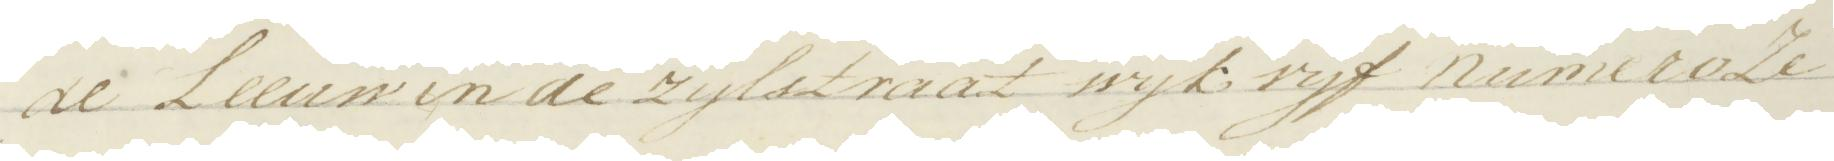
de Leeuw in de zylstraat wyk vyf numero Ze
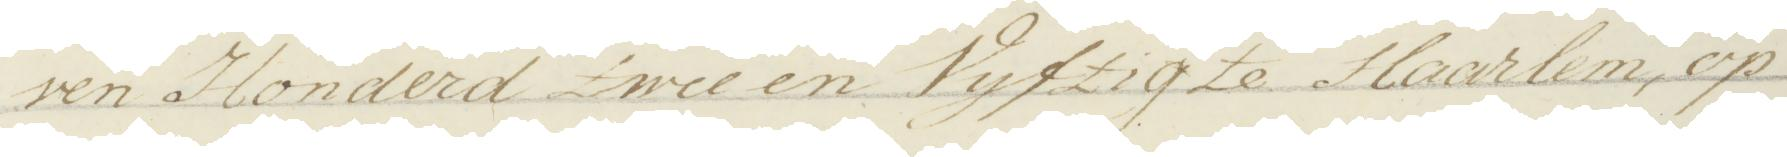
ven Honderd twee en Vyftig te Haarlem, op
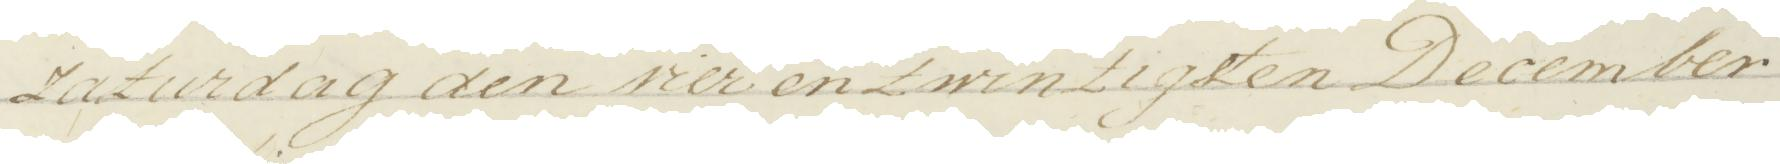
zaturdag den vier en twintigsten December
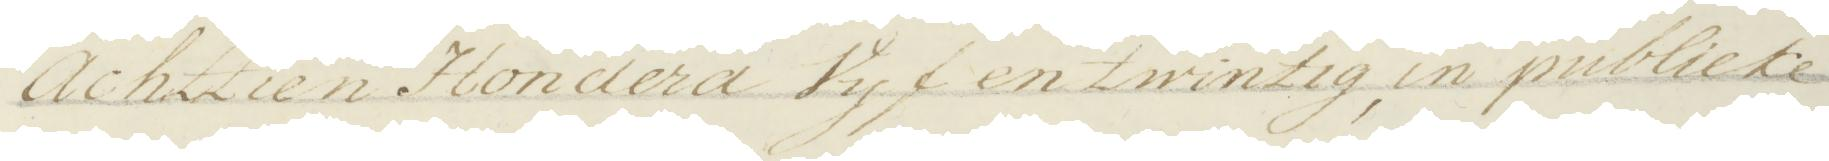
Achttien Honderd Vyf en twintig in publieke
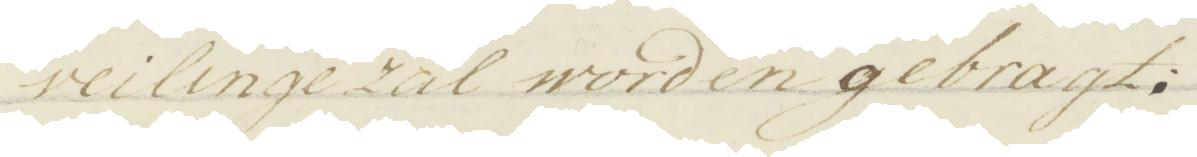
veilinge zal worden gebragt;
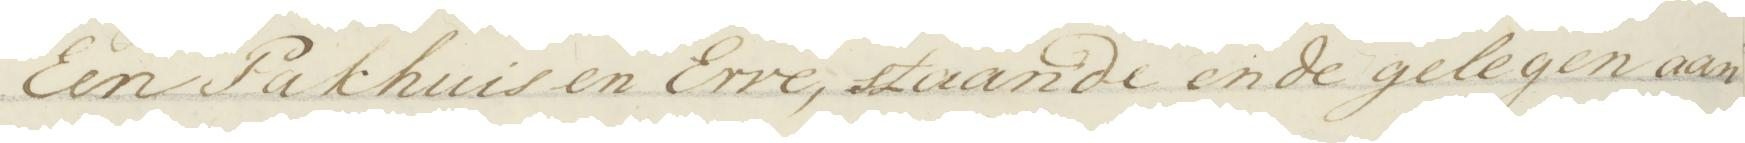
Een Pakhuis en Erve, staande ende gelegen aan
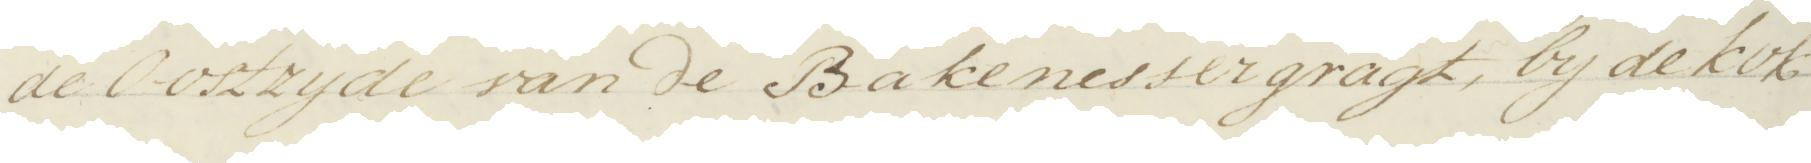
de Oostzyde van de Bakenessergragt, by de kok
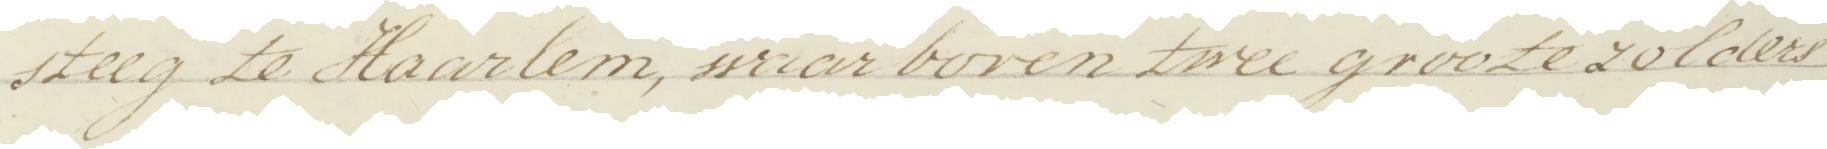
steeg te Haarlem, waar boven twee groote zolders
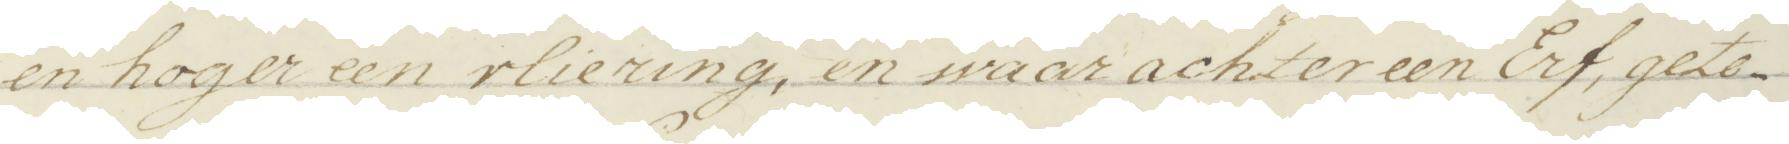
en hoger een vliering, en waar achter een Erf, gete-
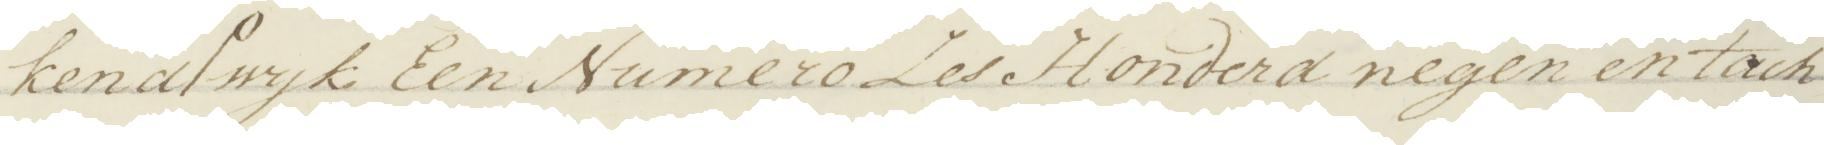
kend wyk Een Numero Zes Honderd negen en tach
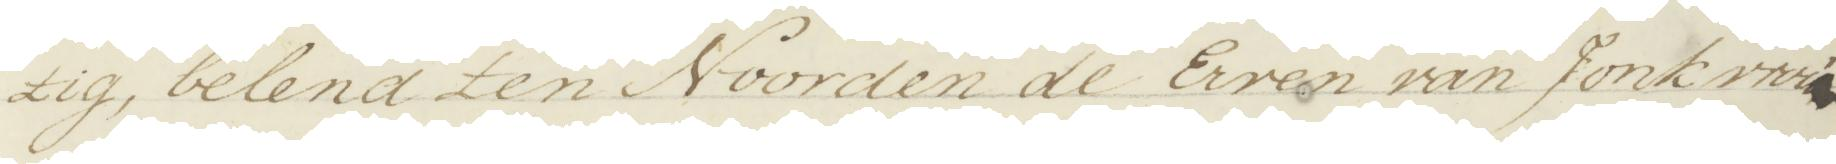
tig, belend ten Noorden de Erven van Jonkvrou
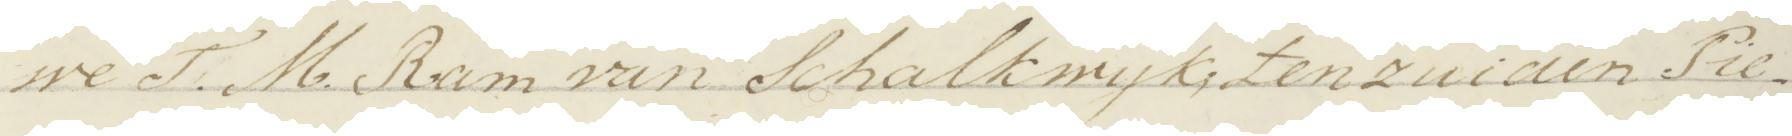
we T. M. Ram van Schalkwyk, ten zuiden Pie-
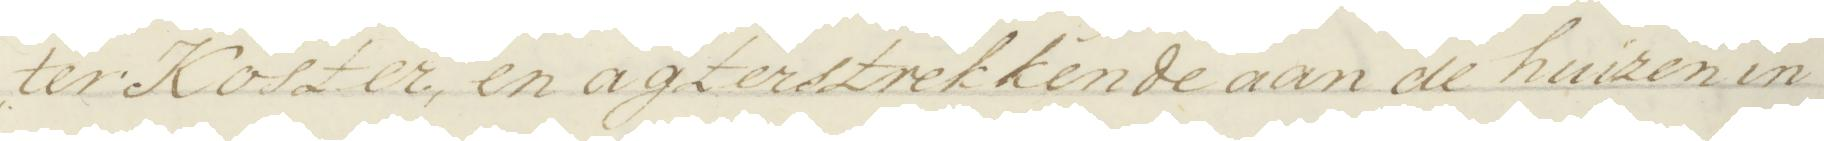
ter Koster, en agterstrekkende aan de huizen in
